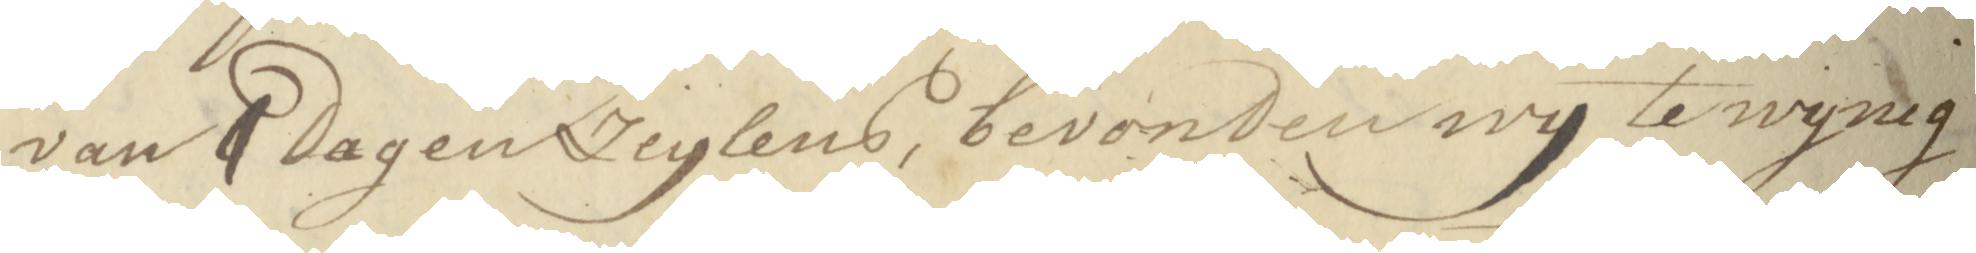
van 4 dagen zeijlens, bevonden wij te wijnig
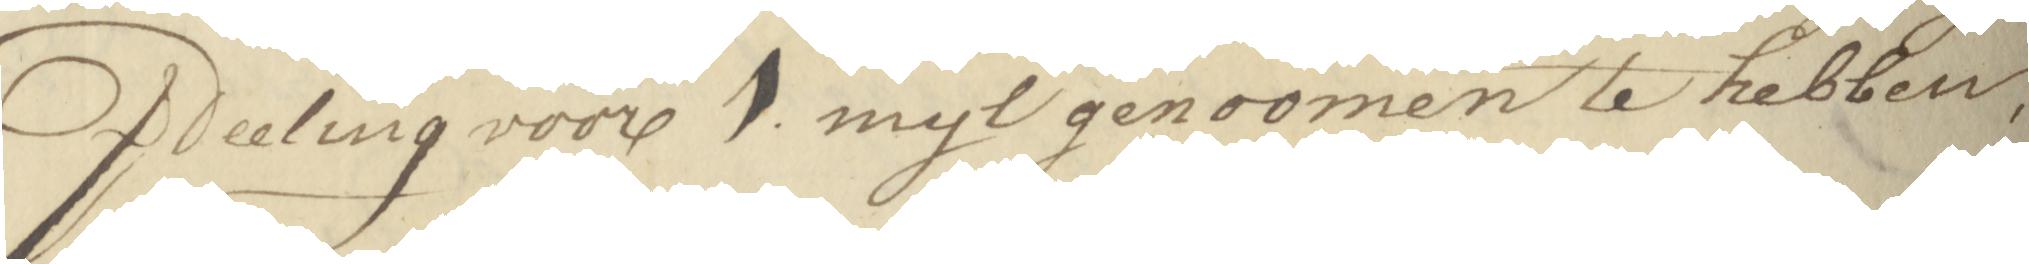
verdeeling voor 1. mijl genoomen te hebben
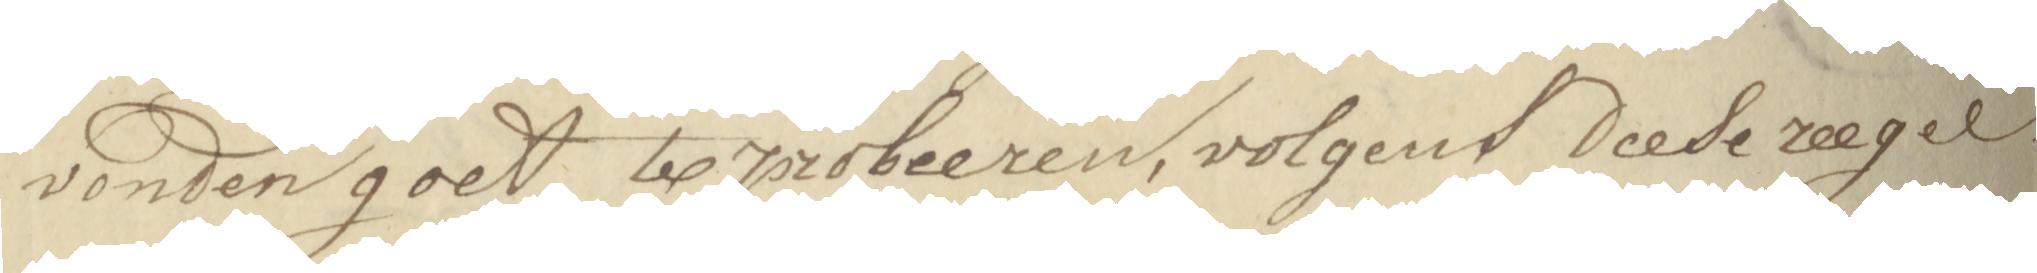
vonden goet te probeeren, volgens deese reegel
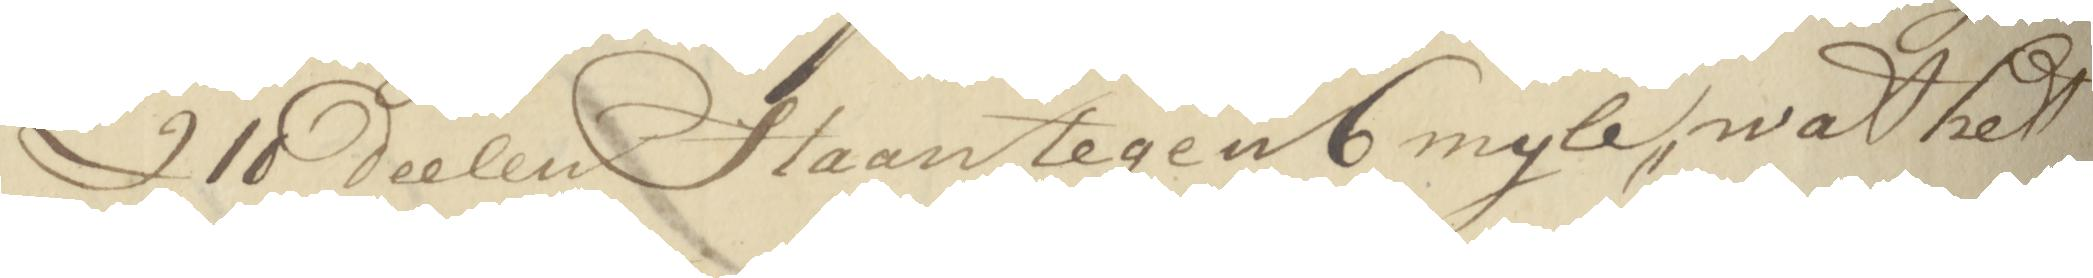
210 deelen staan tegen 6 mijle„ wat het
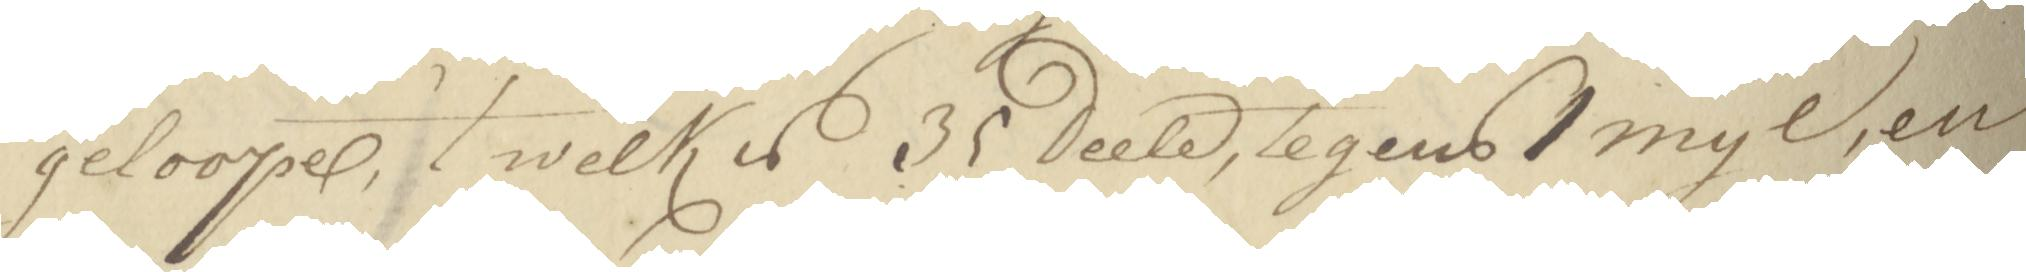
geloope, 't welk is 35 deele, tegens 1 mijl, en
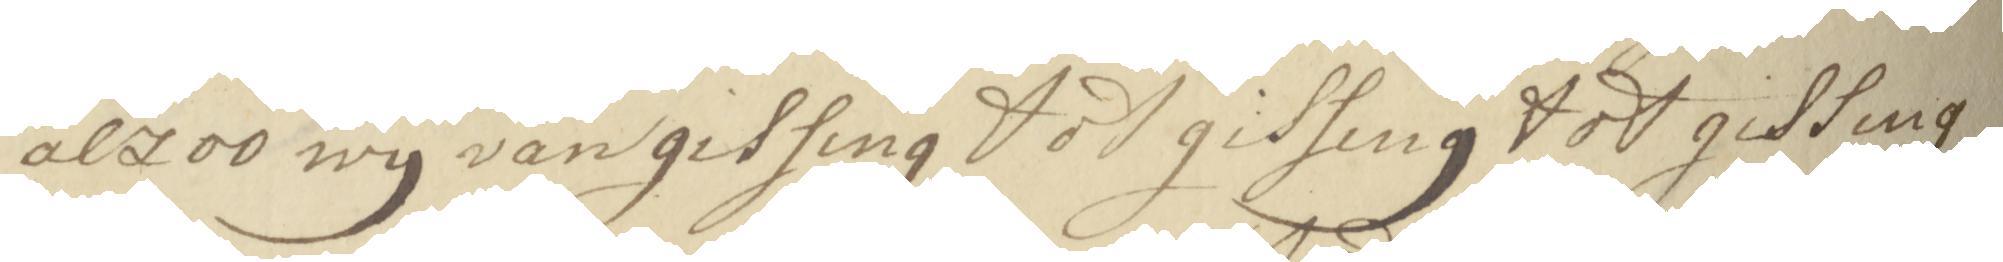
alzoo wij van gissing tot gissing tot gissing
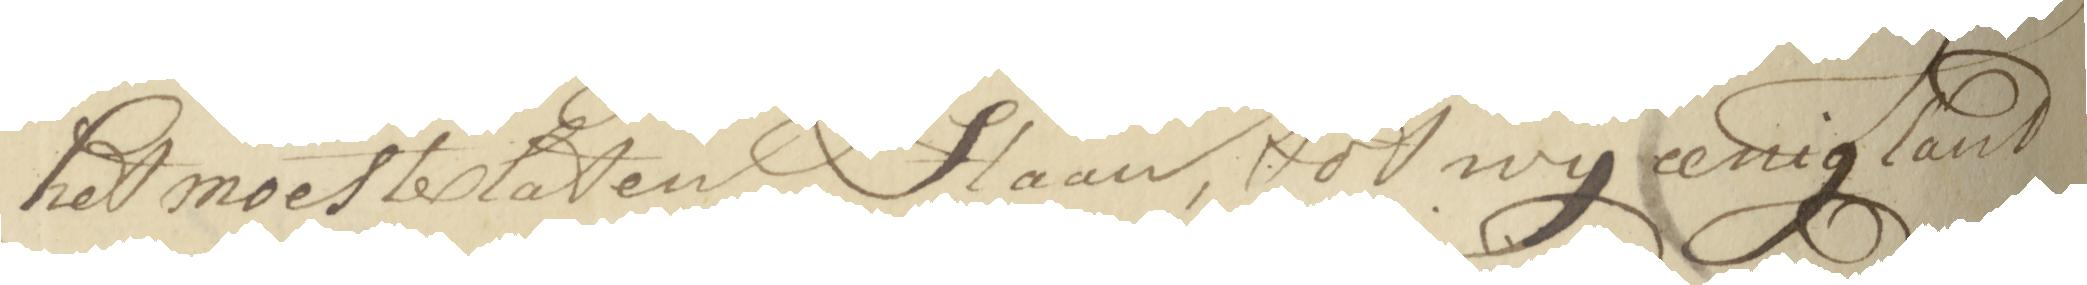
het moeste laten staan, tot wij eenig land
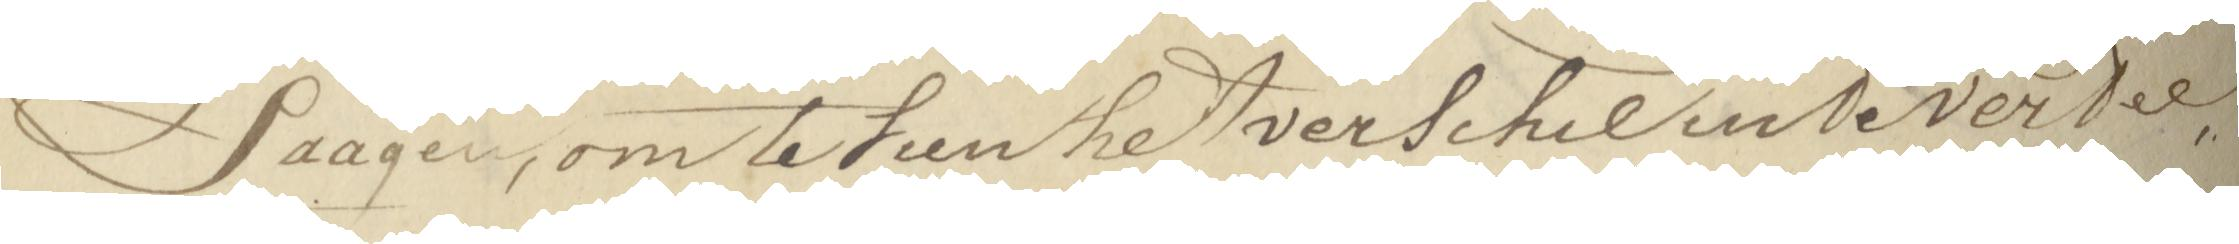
saagen, om te sien het verschil in de verdee„
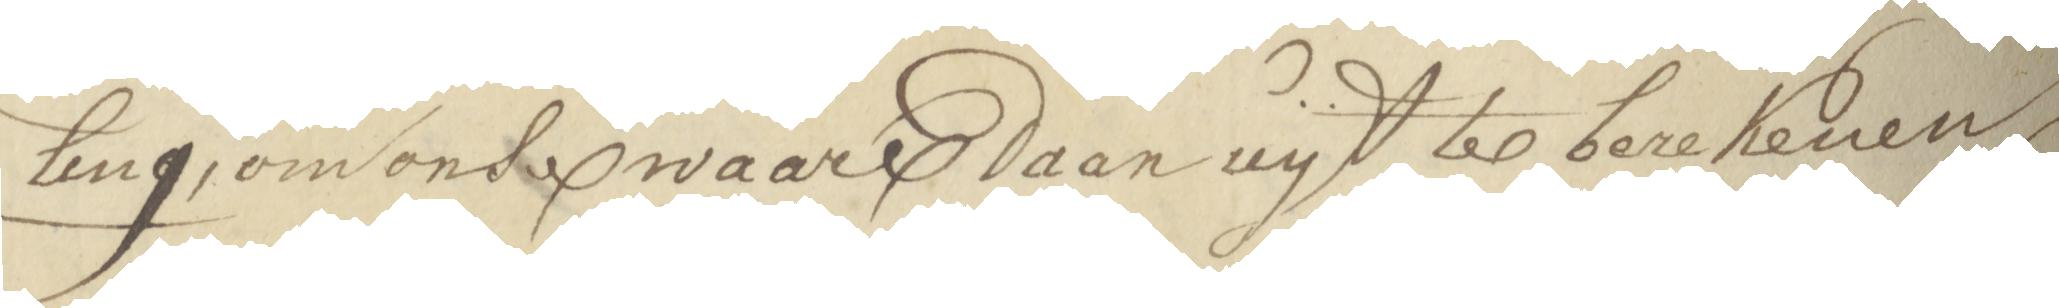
ling, om onse waare daar uijt te berekenen
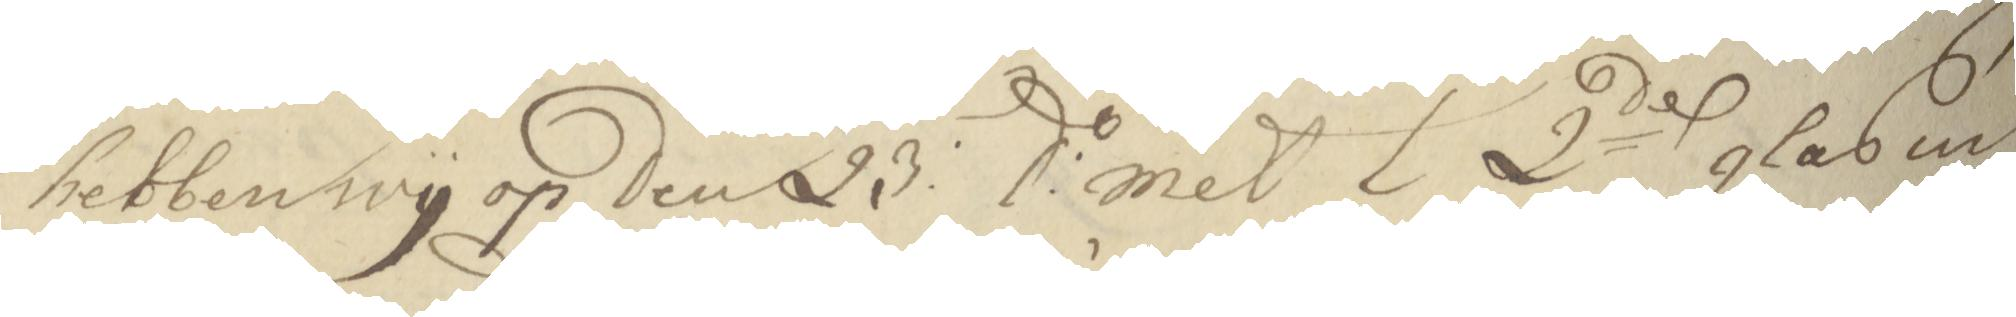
hebben wij op den 23:' d:o met ’t 2=de glas in
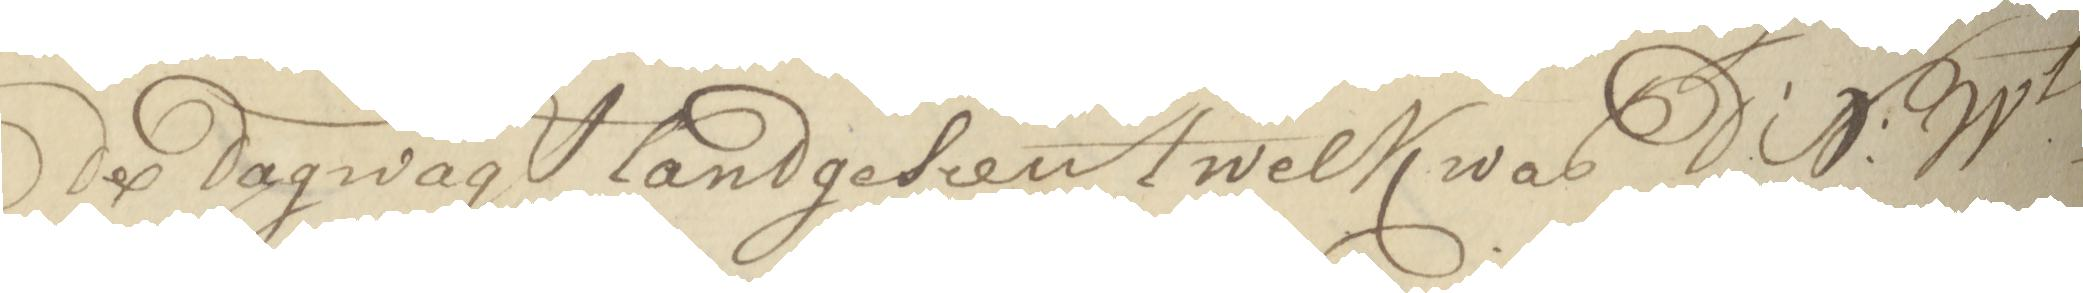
de dagwagt land gesien 't welk was d: N: W.t
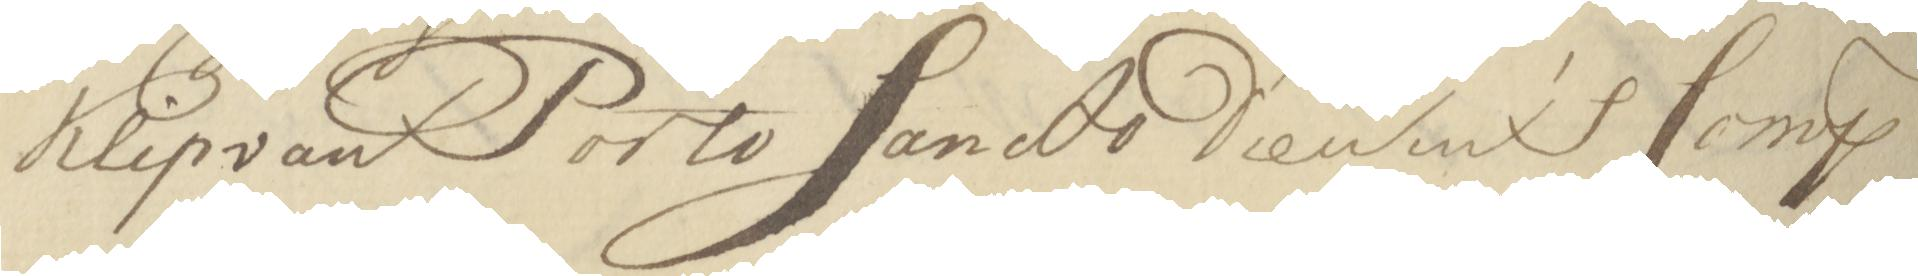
klip van Porto Sancto dien in 's Comp:s
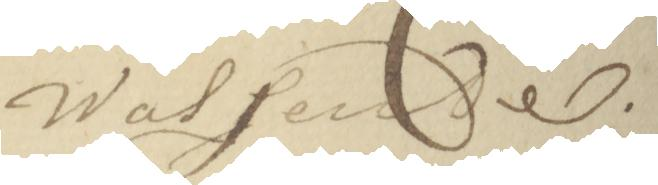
was sende.
